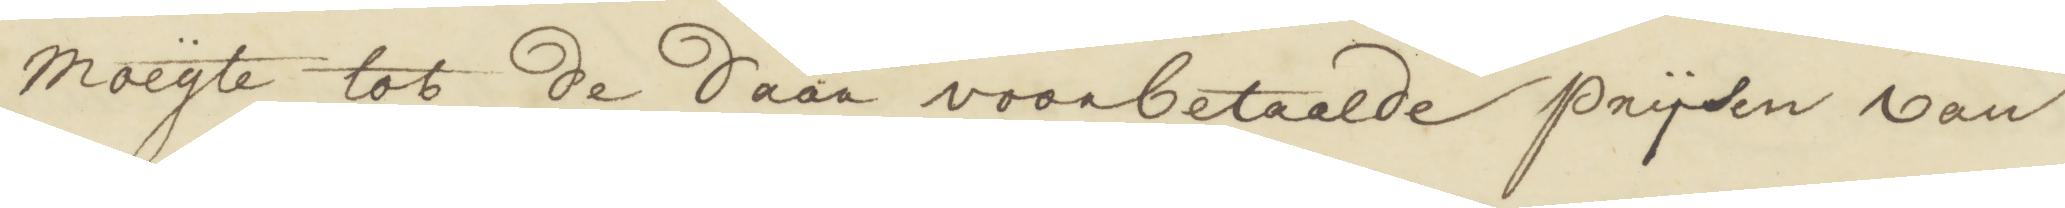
moeijte tot de daar voorbetaalde prijsen van
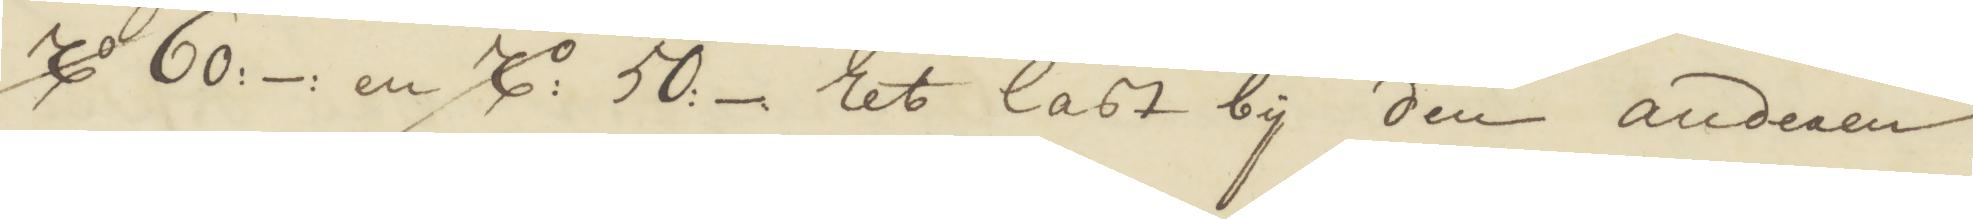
r:o 60:—: en r:o 50:—. het last bij den anderen
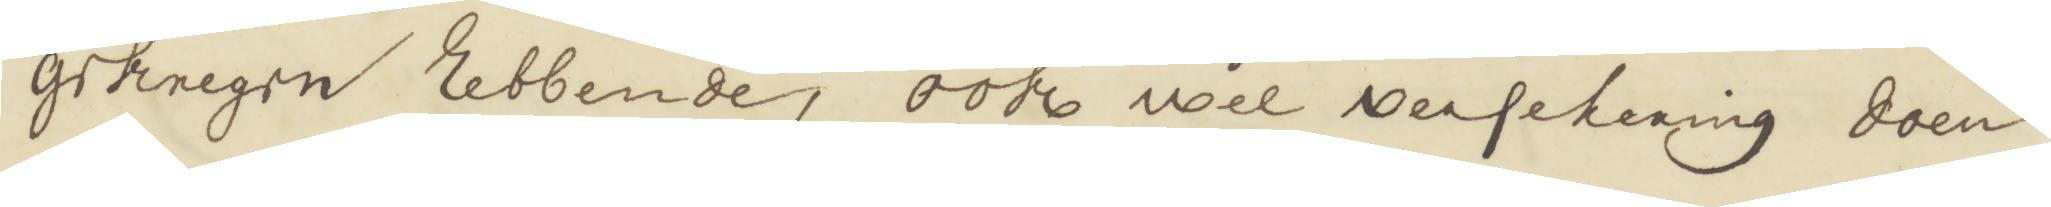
gekregen hebbende, ook wel versekering doen
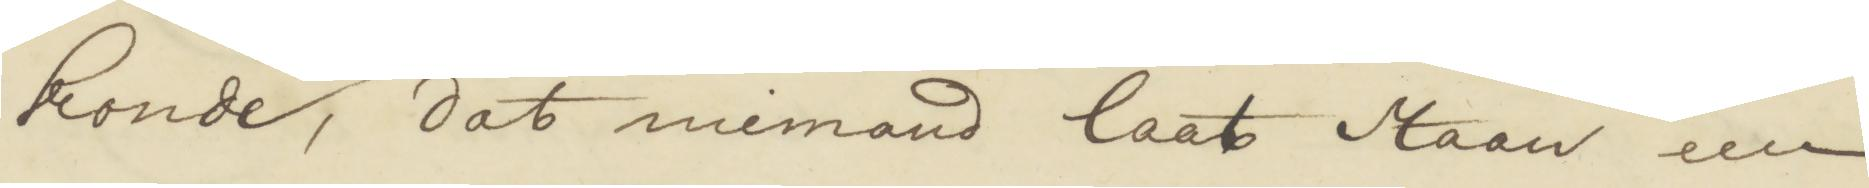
konde, dat niemand laat staan een
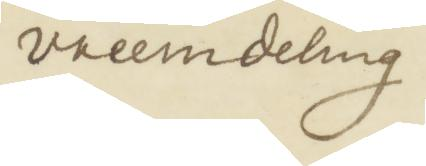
vreemdeling
